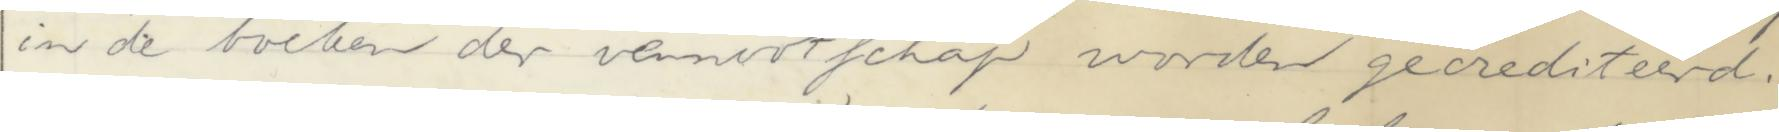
in de boeken der vernootschap worden gecrediteerd.
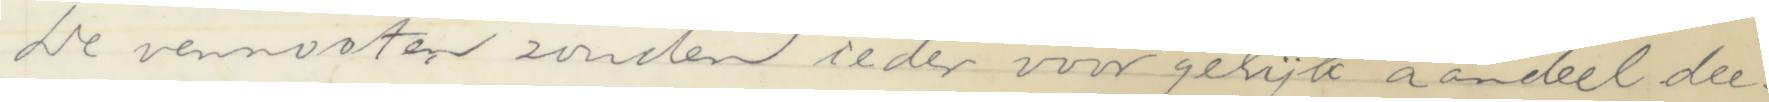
De vennooten zouden ieder voor gelijk aandeel dee
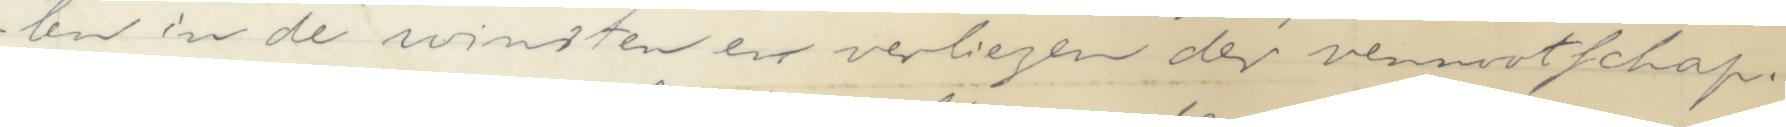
len in de winsten en verliezen der vennootschap.
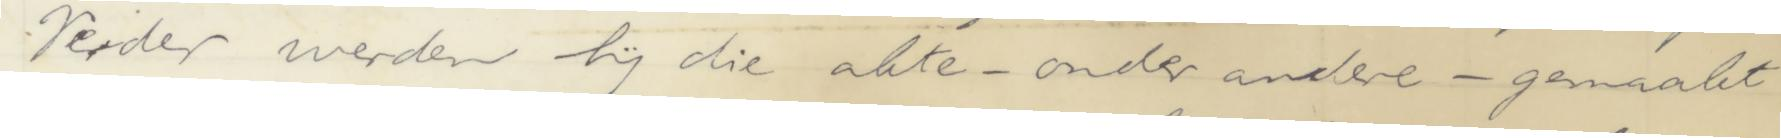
Verder werden bij die akte - onder andere - gemaakt
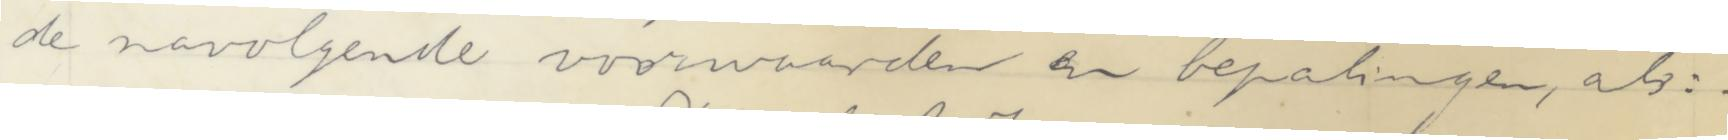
de navolgende voorwaarden en bepalingen, als:
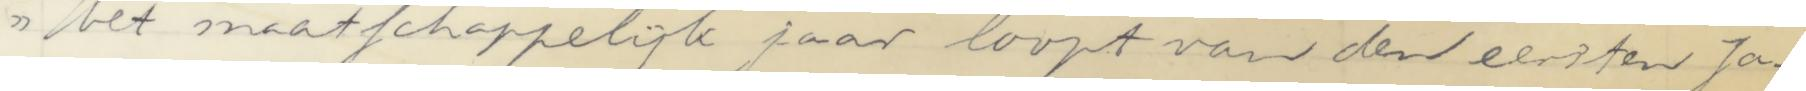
„Het maatschappelijk jaar loopt van den eersten Ja-
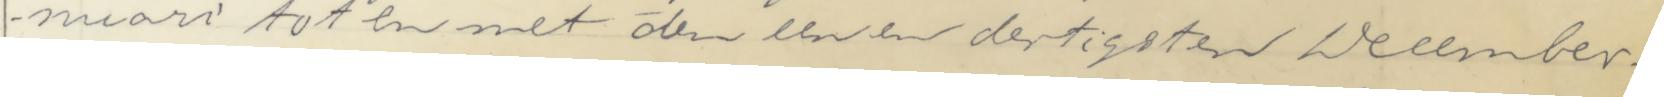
-nuari tot en met den een en dertigsten December.
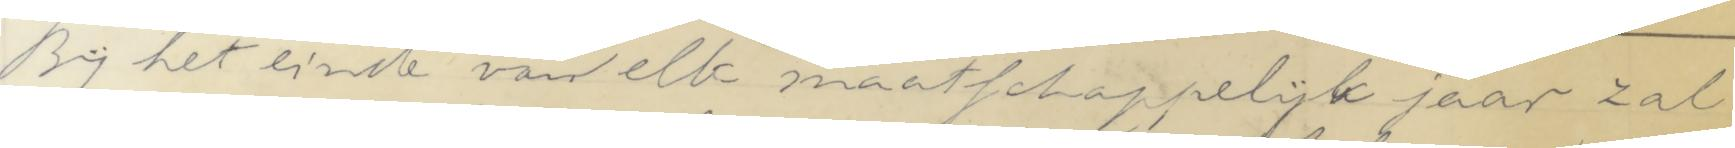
Bij het einde van elk maatschappelijk jaar zal
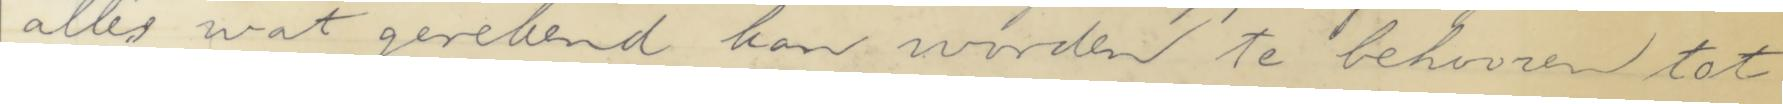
alles wat gerekend kan worden te behooren tot
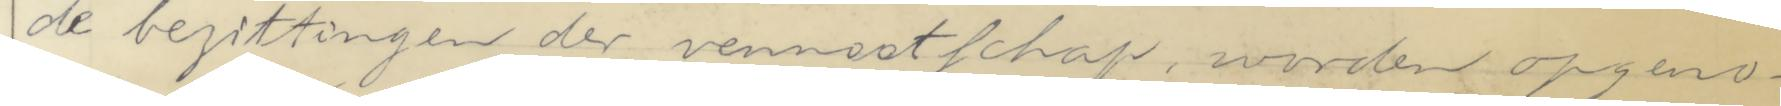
de bezittingen der vennootschap, worden opgeno
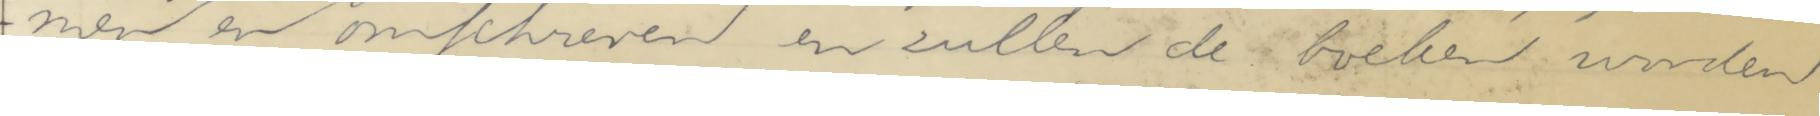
-men en omschreven en zullen de boeken worden
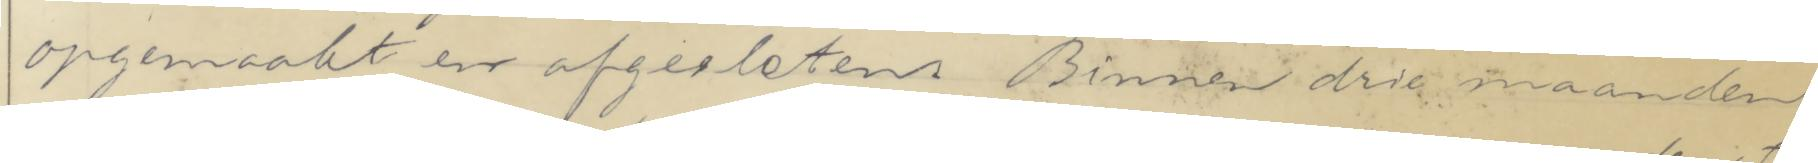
opgemaakt en afgesloten. Binnen drie maanden
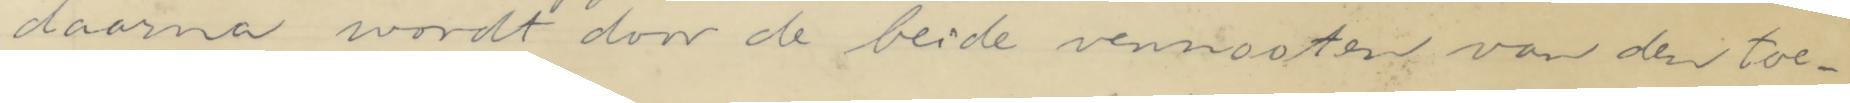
daarna wordt door de beide vennooten van den toe-
